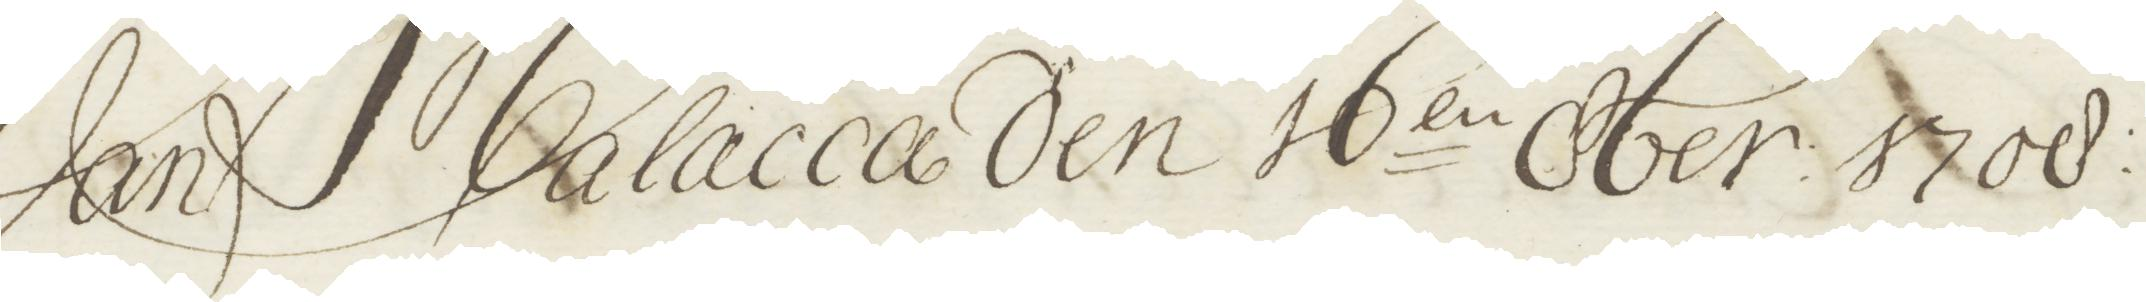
Van Malacca den 16=en 8ber: 1708:
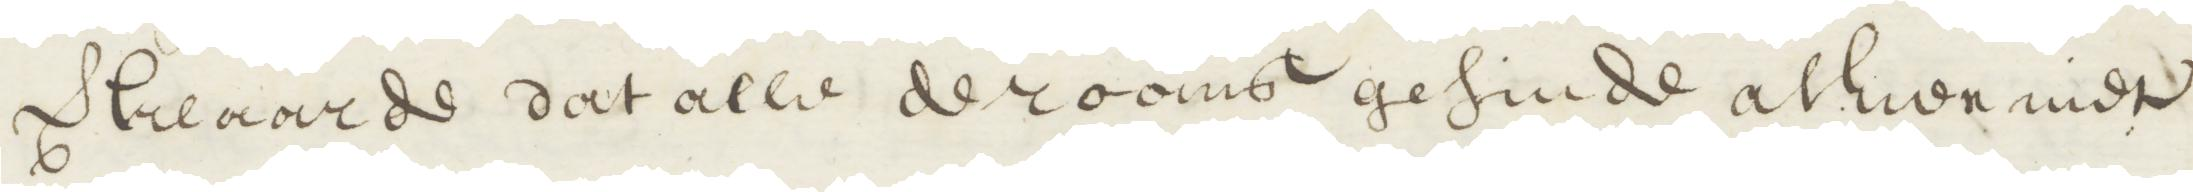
verklaarde dat alle de rooms gesinde alhier niet
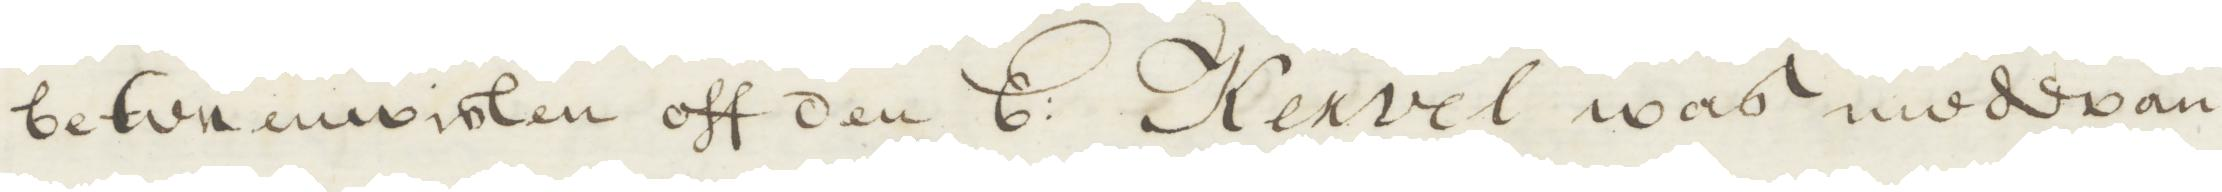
beter enwisten off den E: Kervel was mede van
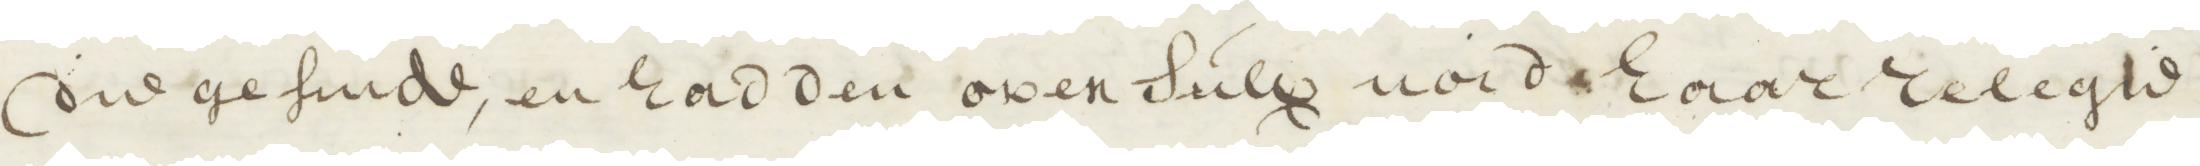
die gesinde, en hadden over sulx noid haar relegie
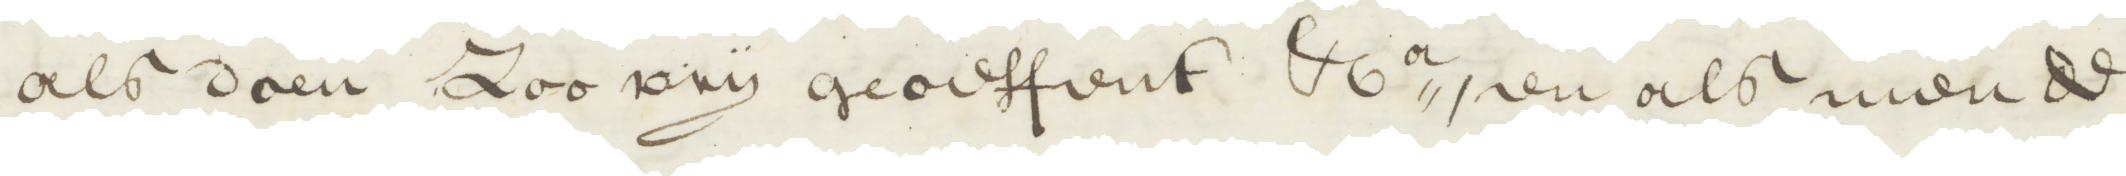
als doen zoo vrij geoeffent &c„a, en als men de
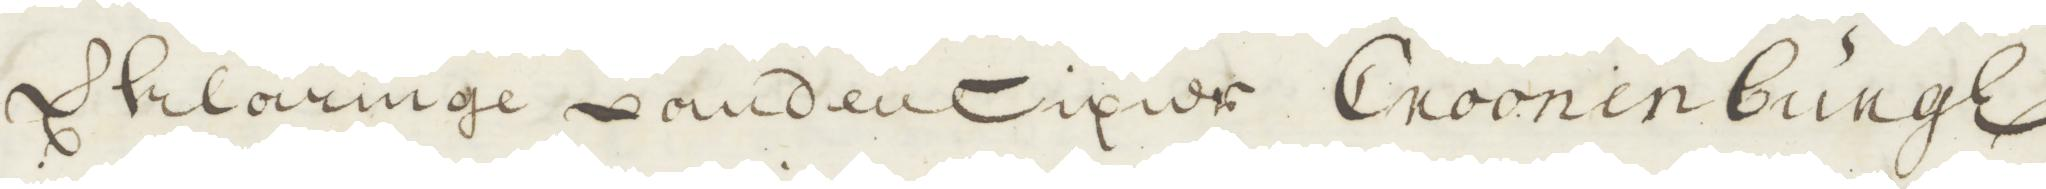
verklaringe van den cipier Croonenburgh
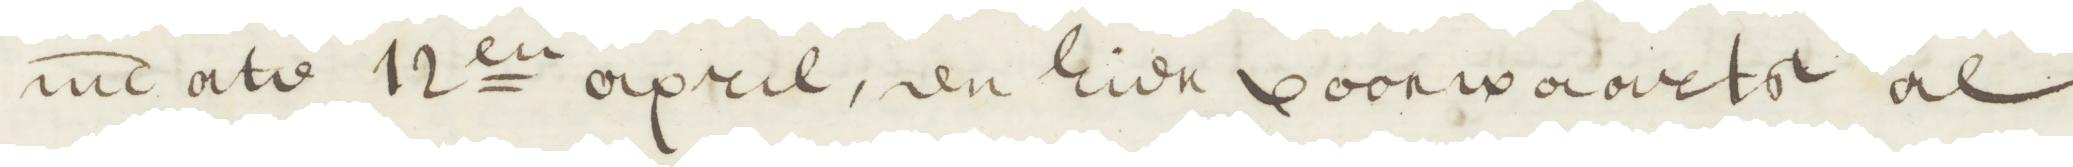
in dato 12=en april, en hier voorwaarts al
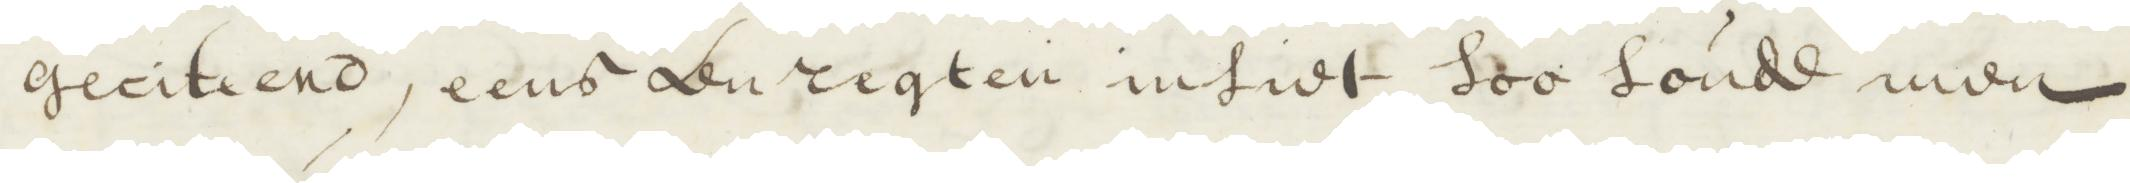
geciteerd, eens ten regten insiet soo soude men
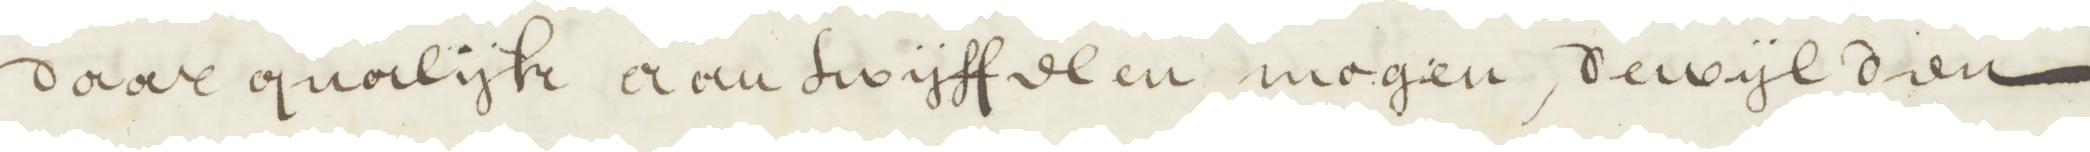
daar qualijk aan twijffelen mogen, dewijl den
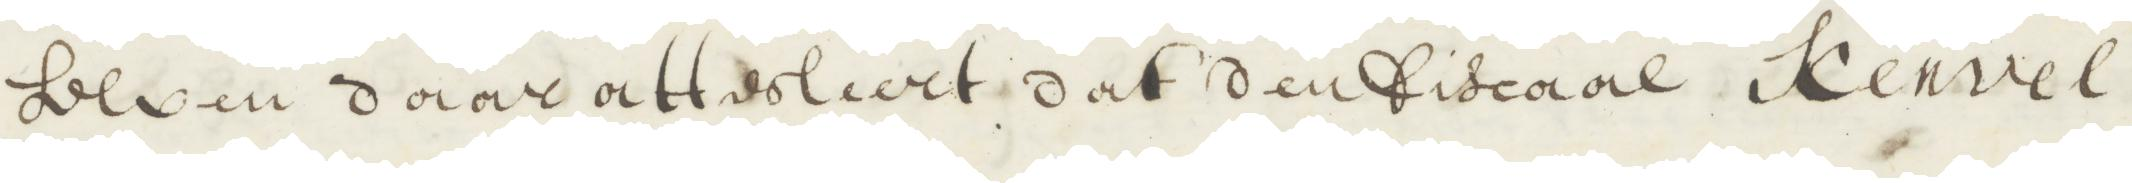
selven daar attesteert dat den fiscaal Kervel
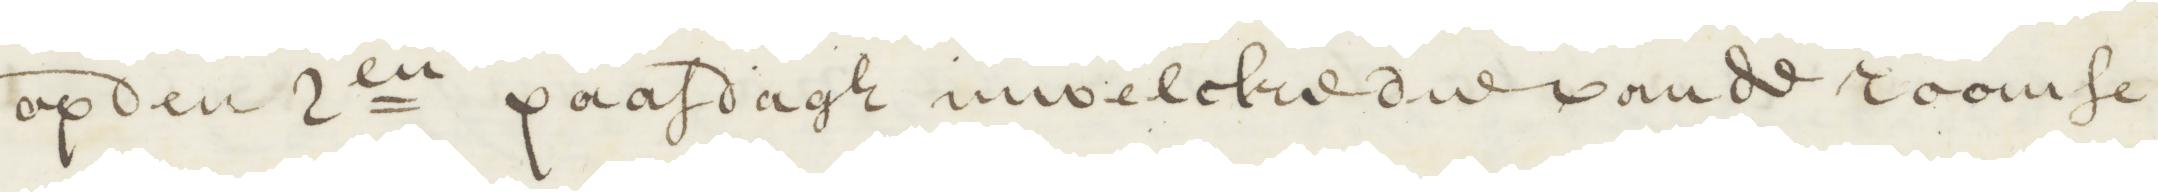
op den 2=en paasdagh inwelcke die van de roomse
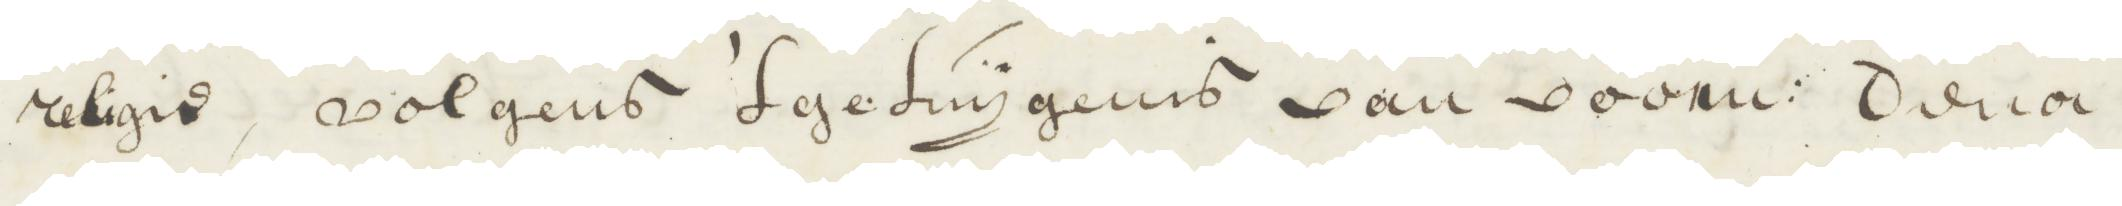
religie, volgens 't getuijgenis van voorn: Oena
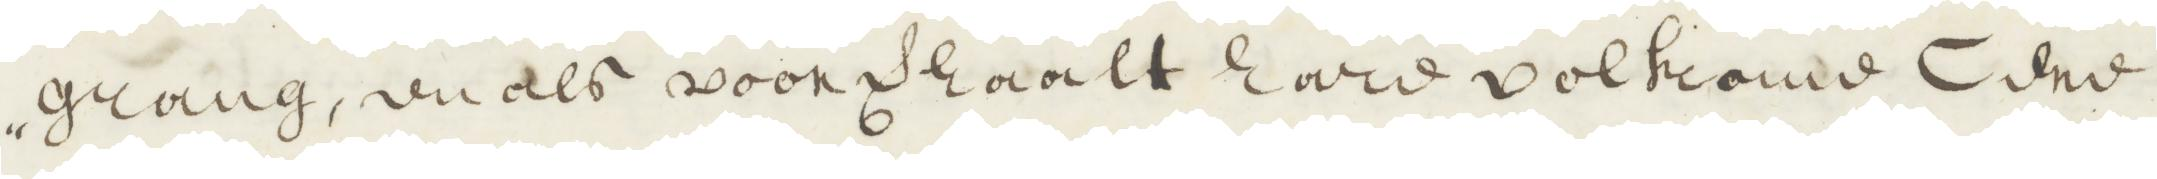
„grang, en als voorverhaalt hare volkome Cere
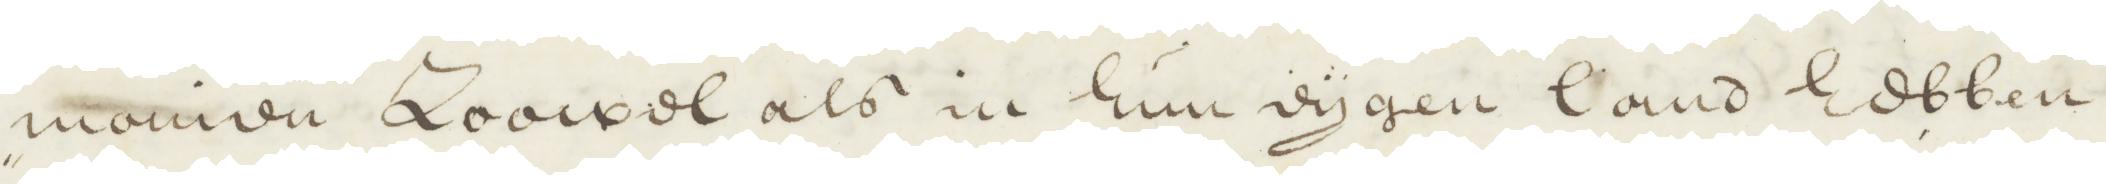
„monien zoowel als in hun eijgen land hebben
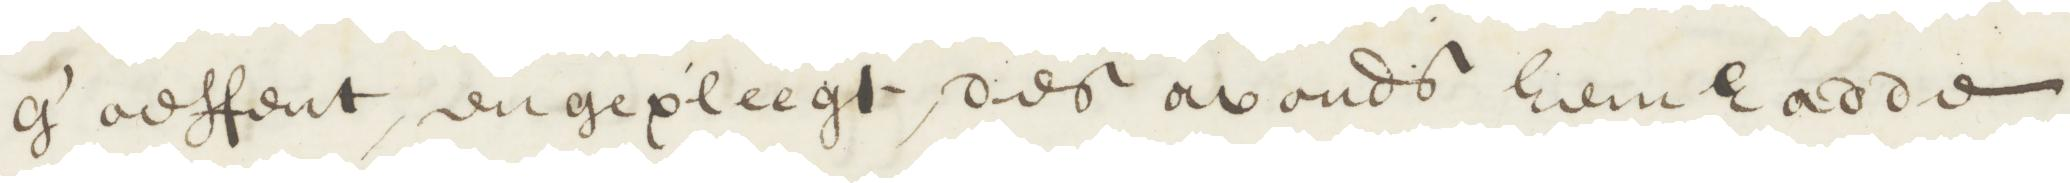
g’oeffent, en gepleegt, des avonds hem hadde
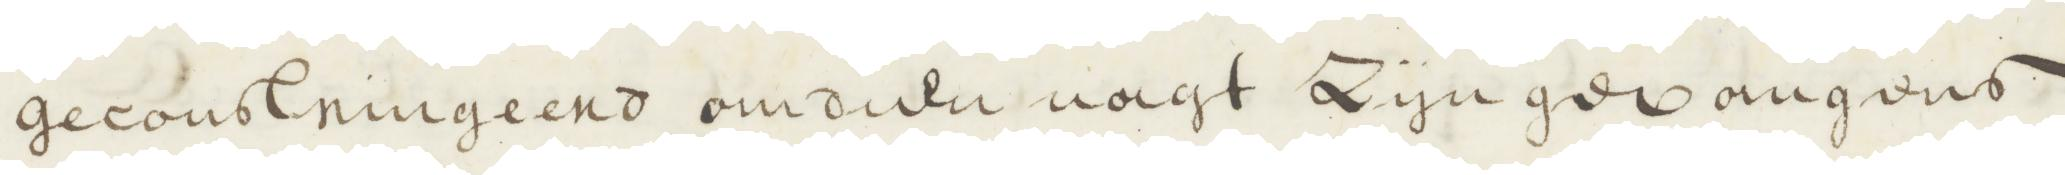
geconstringeerd om dien nagt zijn gevangens
